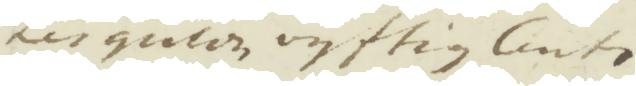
zes gulden vyftig Cents
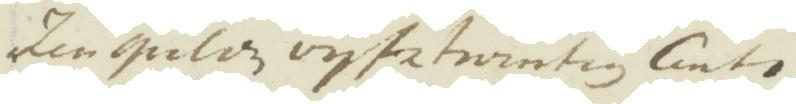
Zes gulden vyf en twintig Cents
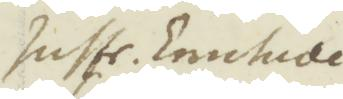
Juffr. Enschédé
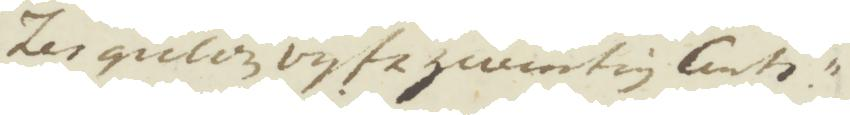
Zes gulden vyf en zeventig Cents.„
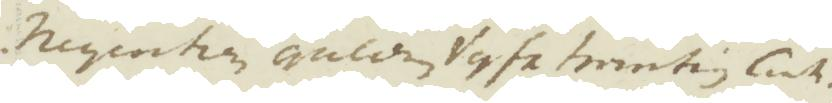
negentien gulden Vyf en twintig Cents.
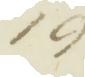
1G
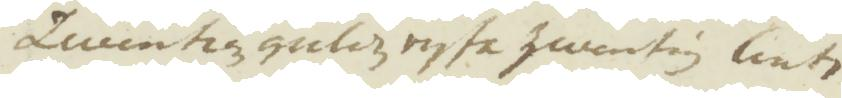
Zeventien gulden vijf en zeventig Cents
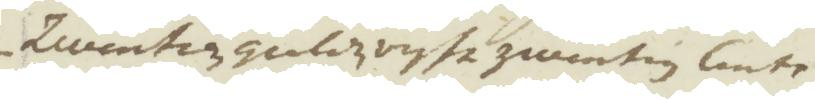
Zeventig gulden vyf en zeventig Cents
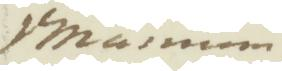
VMasman
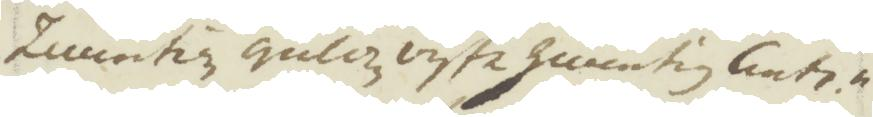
Zeventien gulden vyf en zeventig Cents. „
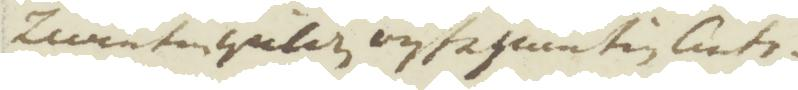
Zeventien gulden vyf en zeventig Cents.
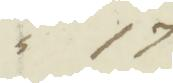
„ 17
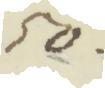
15 50.
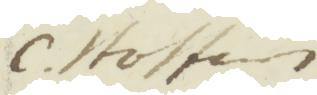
C.Hoffers
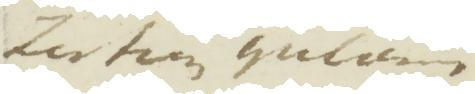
Zestien gulden
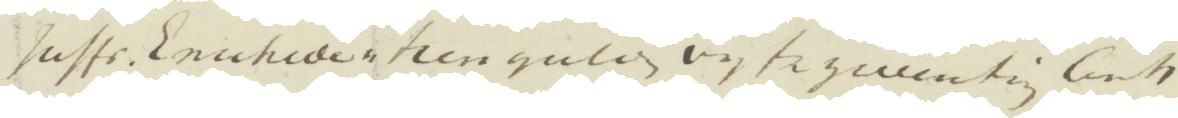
Juffr. Enschedé„ tien gulden vyf en zeventig Cent
